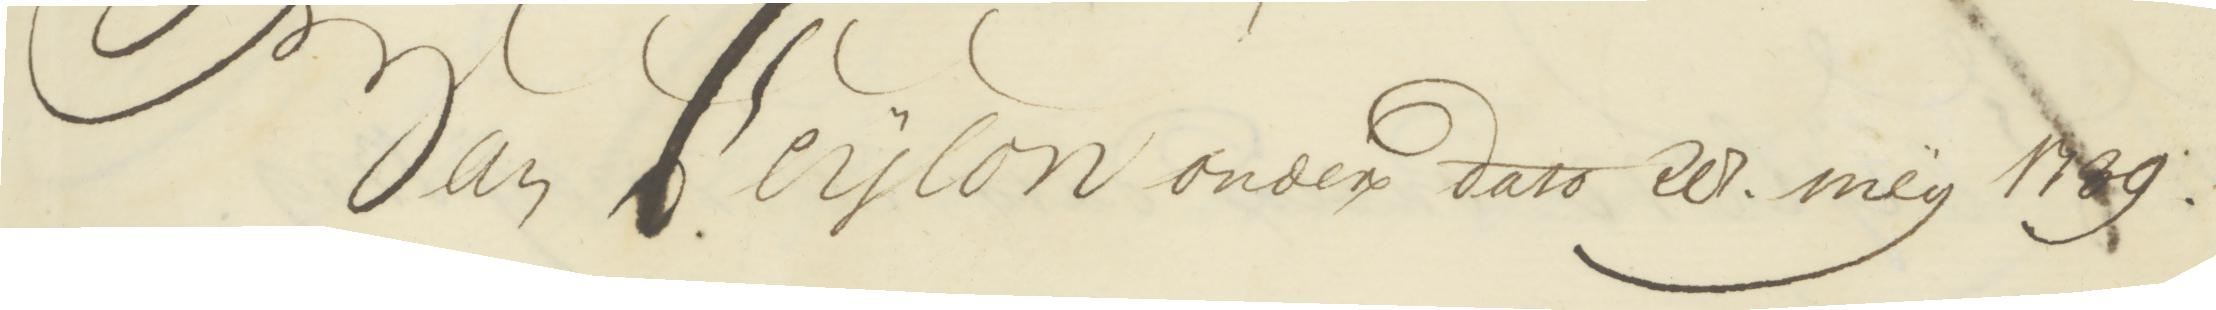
Van Ceijlon onder dato 28. meij 1739:
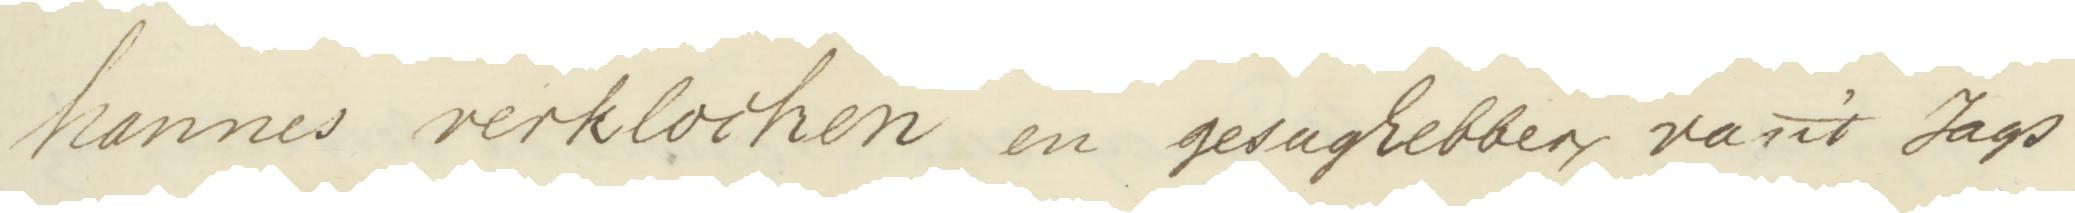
hannes verklocken en gesaghebber van’t Jags
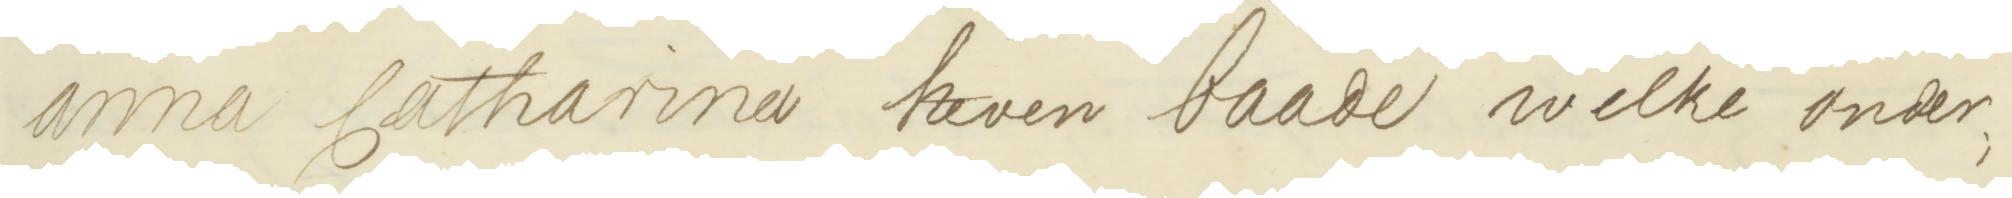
anna Catharina steven baade welke onder„
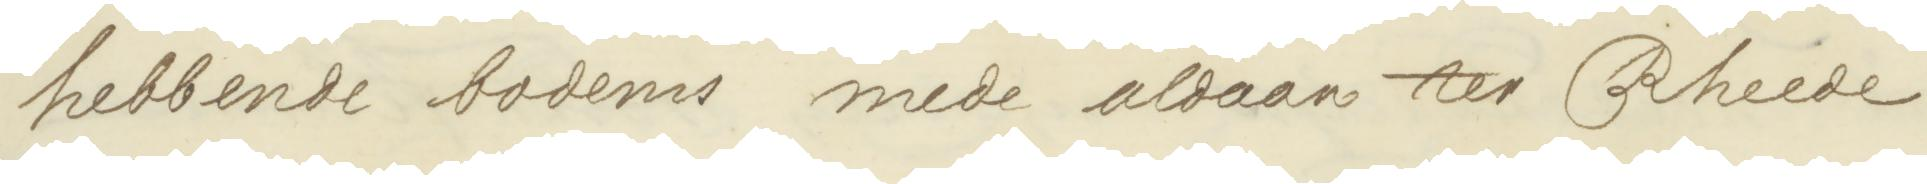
hebbende bodems mede aldaar ter Rheede
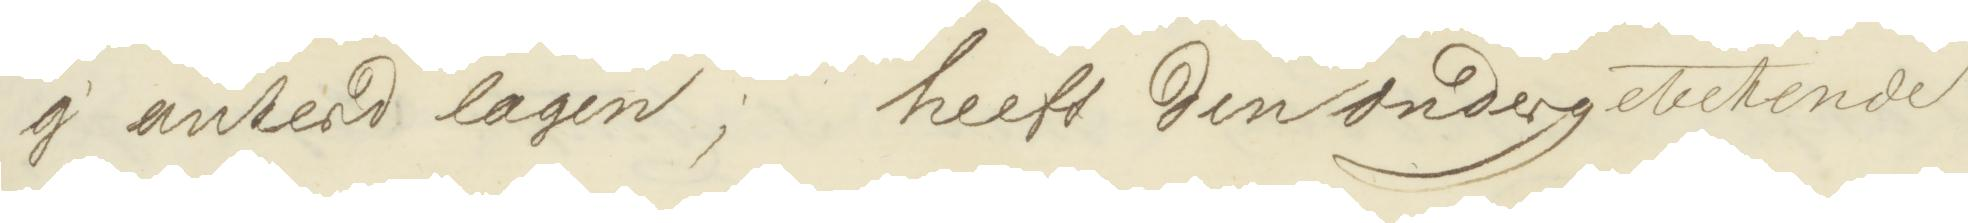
g'ankerd lagen; heeft den ondergeteekende
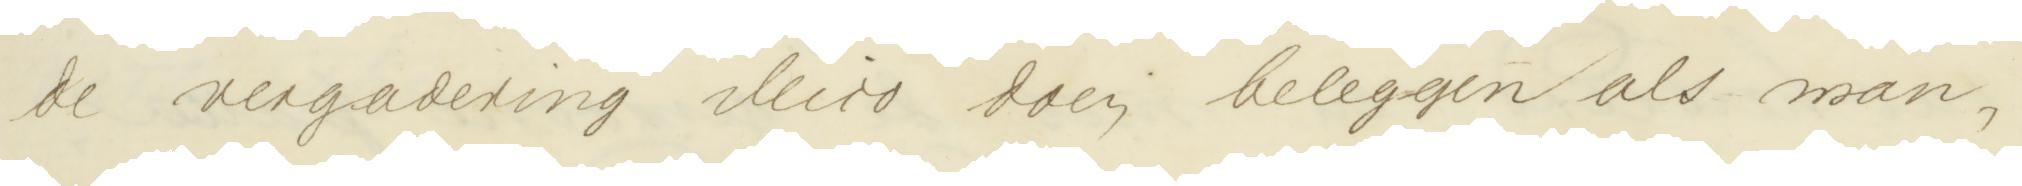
de vergadering illico doen beleggen als wan„
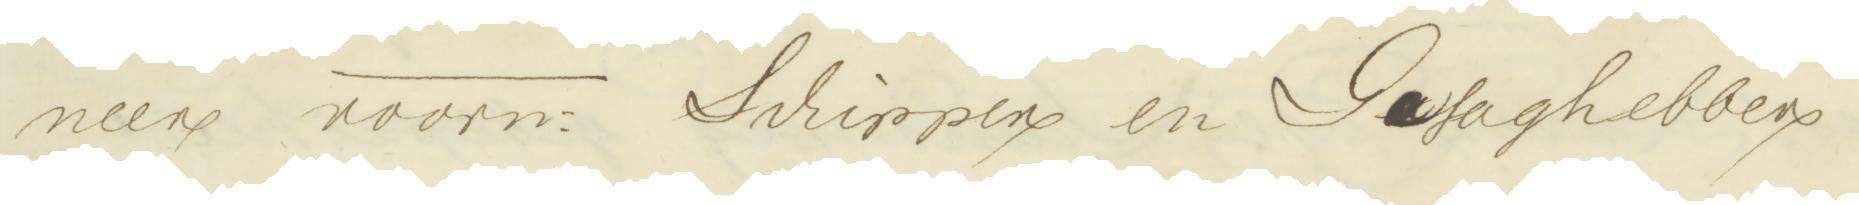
neer voorn: schipper en Gesaghebber
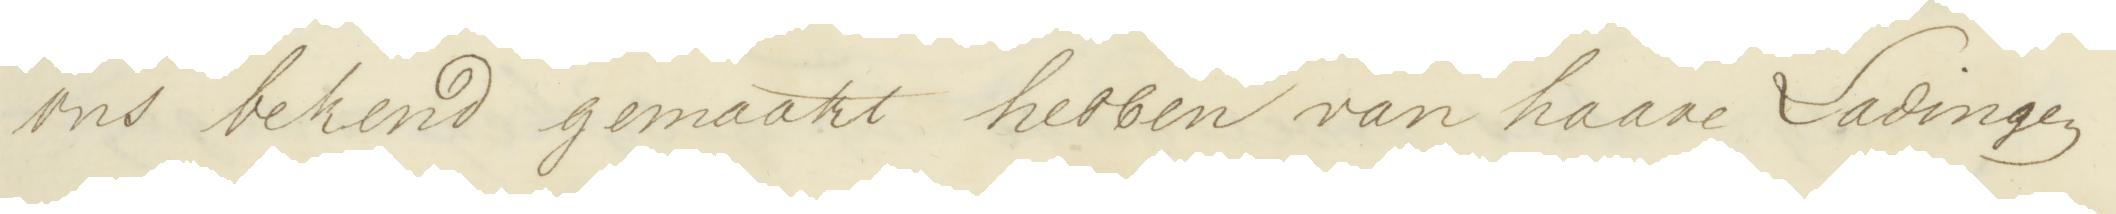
ons bekend gemaakt hebben van haare Ladingen
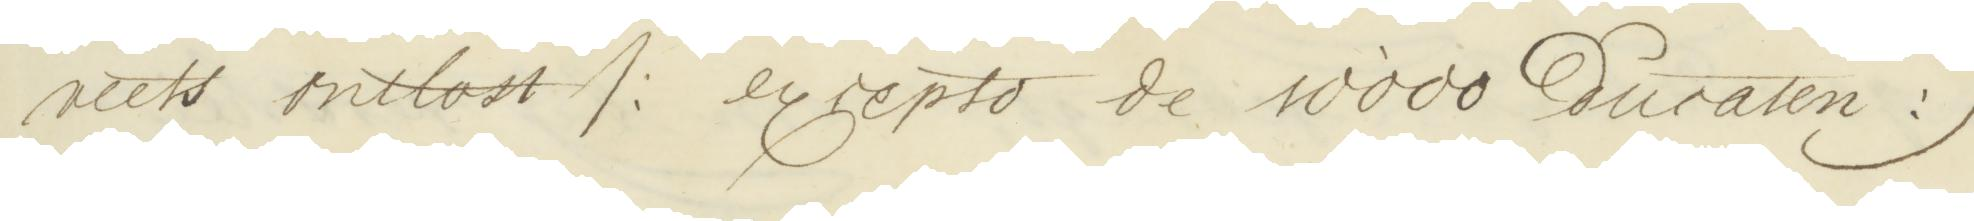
reets ontlost /: excepto de 10000 ducaten:)
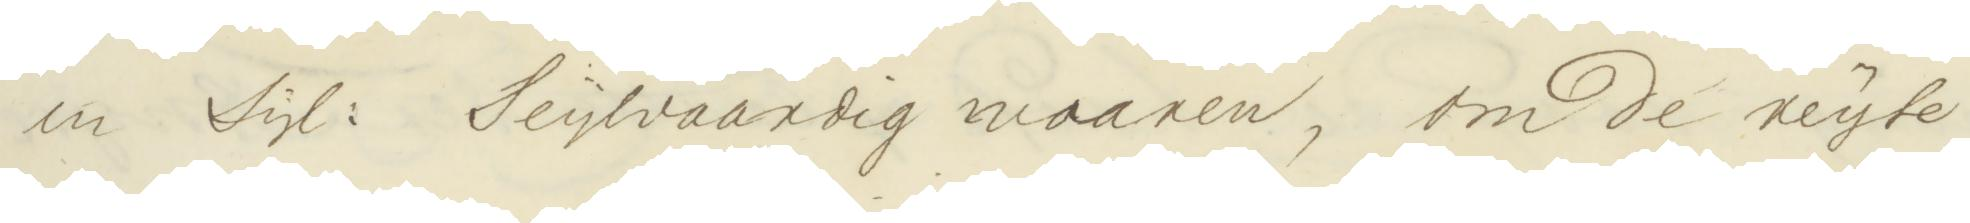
in sijl: seijvaardig waaren, om de reijse
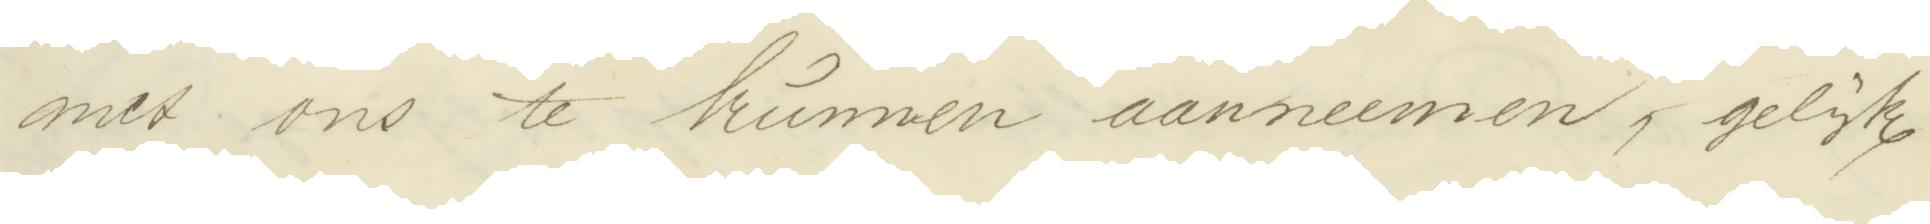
met ons te kunnen aanneemen, gelijk
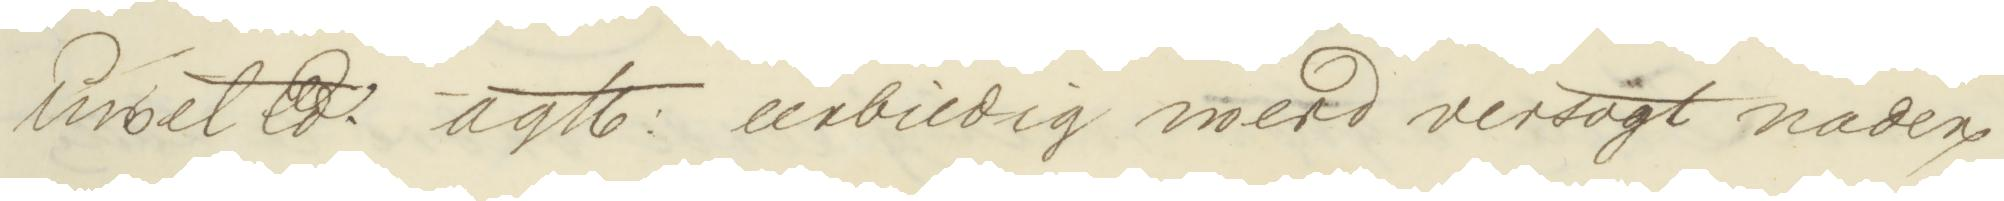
uwel Ed: agtb: eerbiedig werd versogt nader
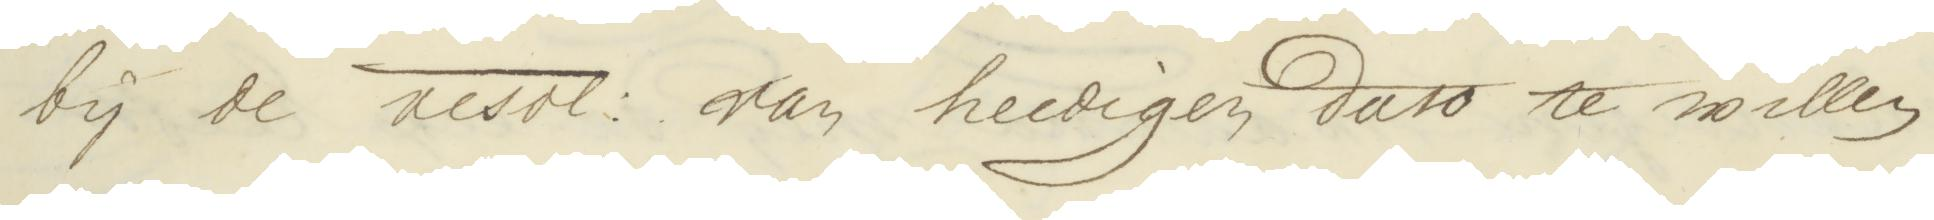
bij de resol: van heedigen dato te willen
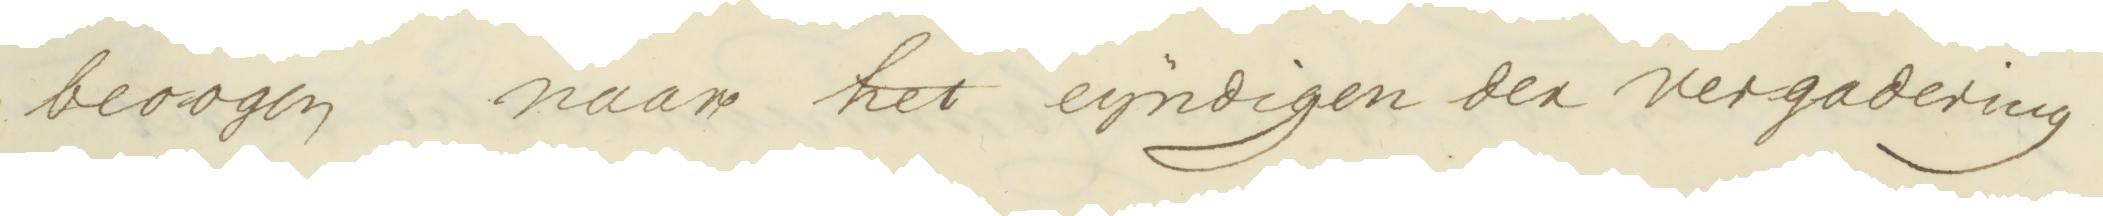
beoogen naar het eijndigen der vergadering
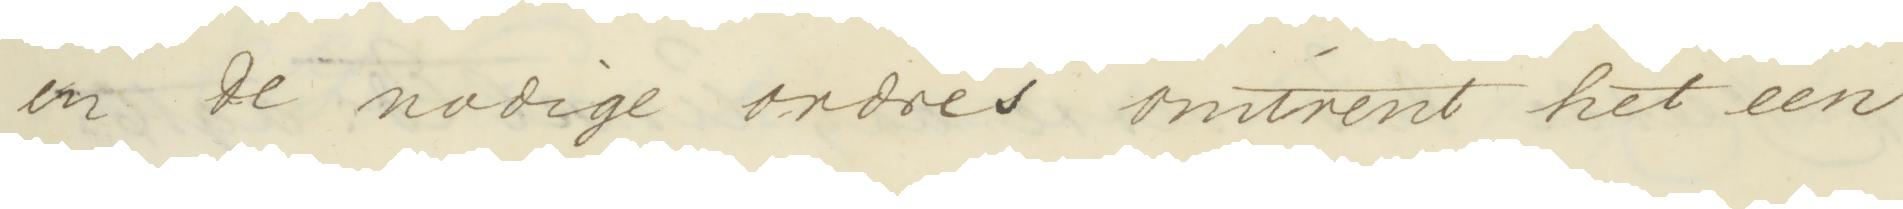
in de nodige ordres omtrent het een
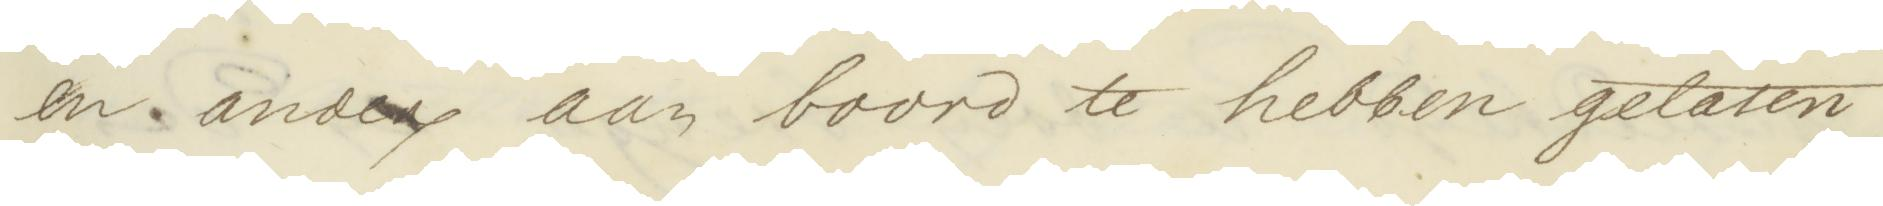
en ander aan boord te hebben gelaten
